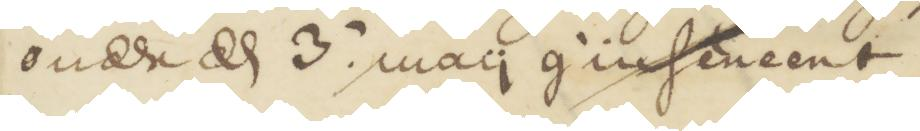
onder den 3.e maij g’inseneert
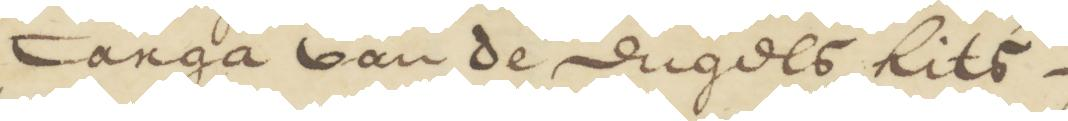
carga van de engels kits
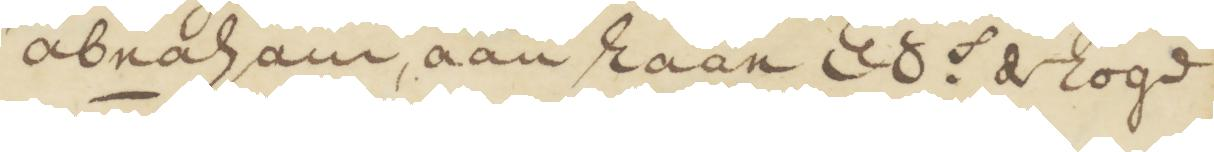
abraham, aan haar Ed.s de hoge
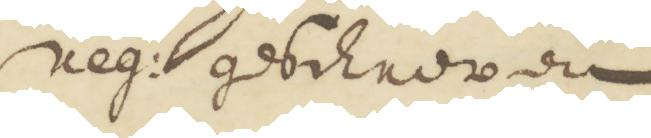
reg: geschreven.
